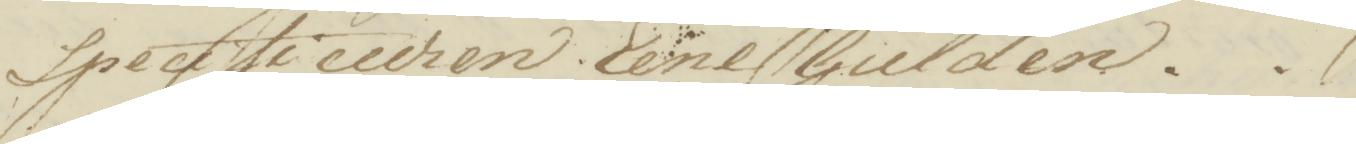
specificeeren, Eene Gulden . . . . . „ 1 „
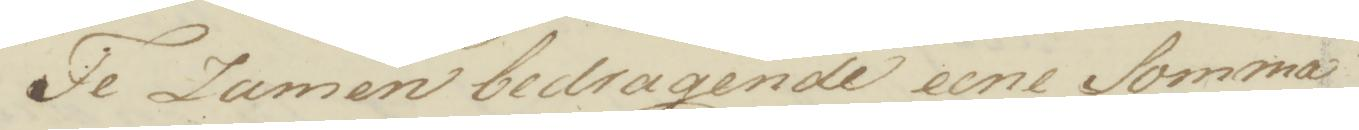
Te zamen bedragende eene somma
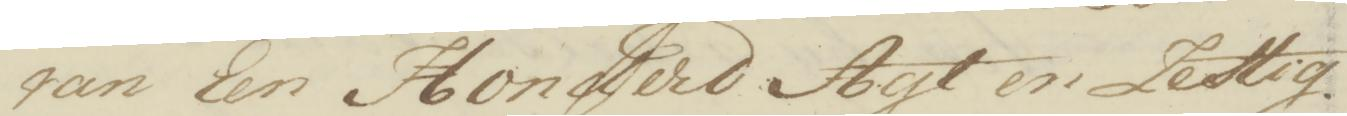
van Een Honderd Agt en Zestig
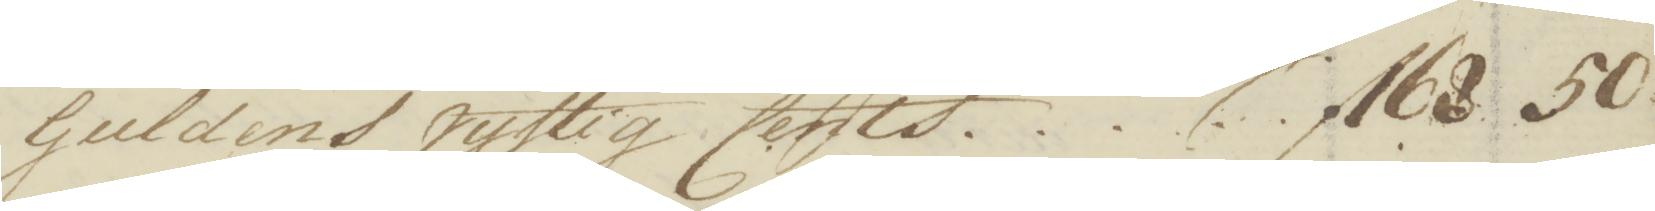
Guldens vyftig Cents . . . . . ƒ168: 50
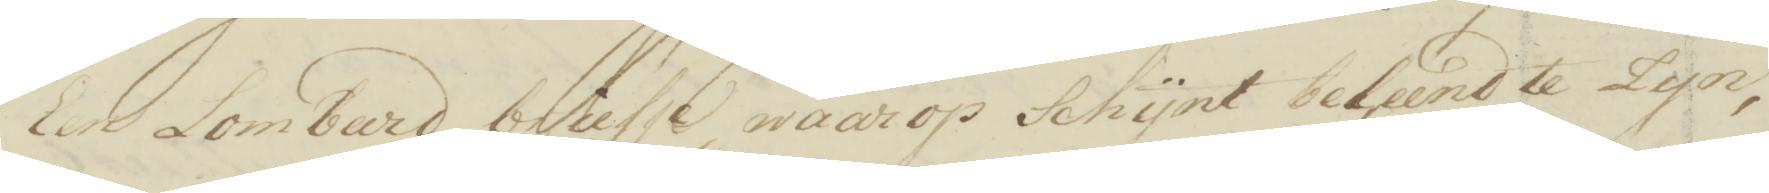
Een Lombard briefje, waarop schijnt beleend te zyn,
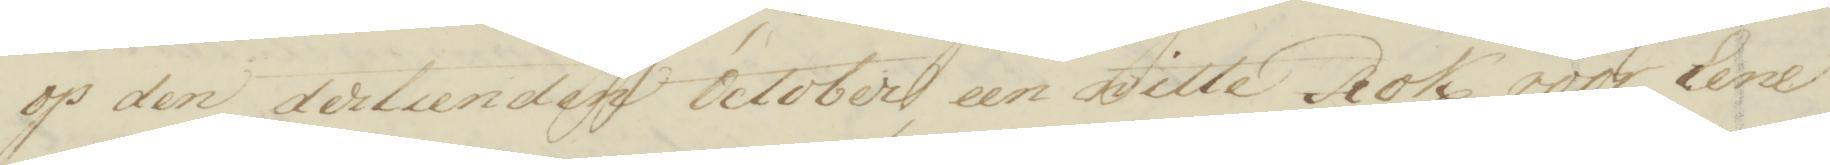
op den dertienden October, een witte Rok voor Eene
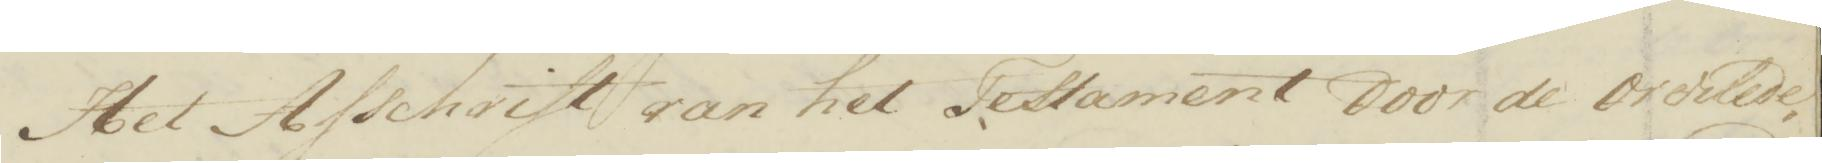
Het Afschrift van het Testament door de overlede„
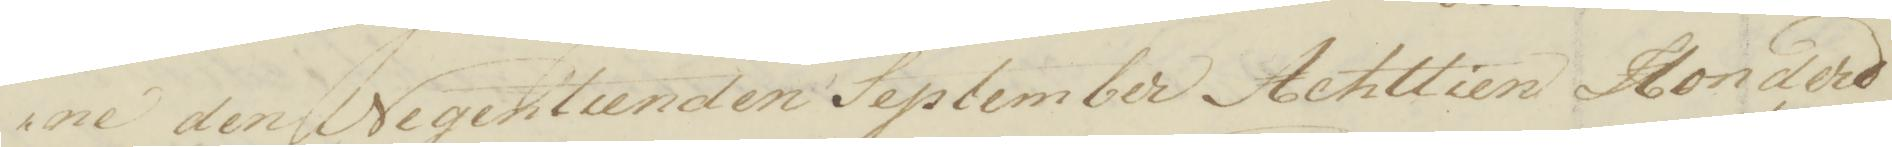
ne den Negentienden September Achttien Honderd
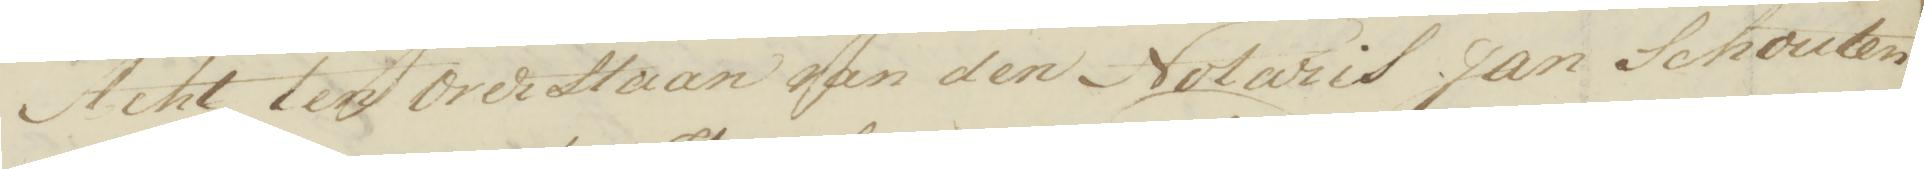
Acht, ten overstaan van den Notaris Jan Schouten
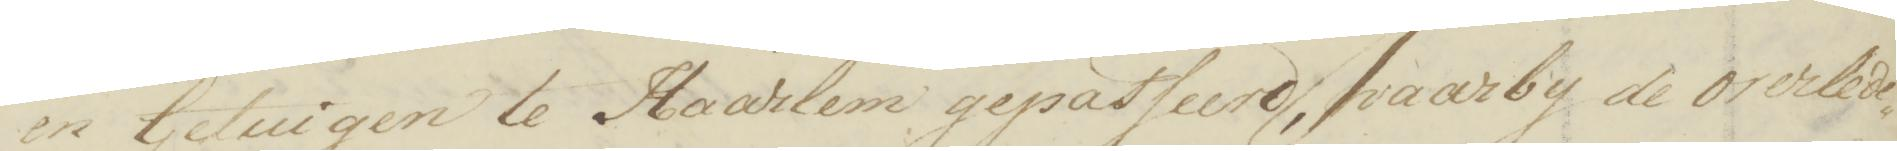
en Getuigen te Haarlem gepasseerd, waarbij de overlede„
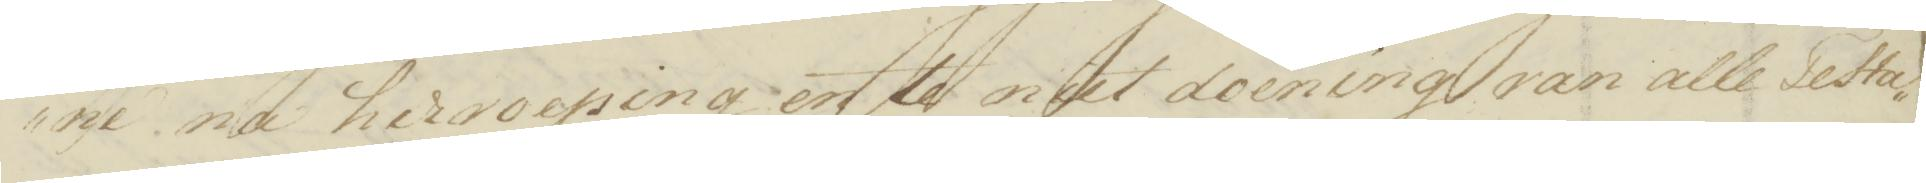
„ne na herroeping en te niet doening van alle Testa„
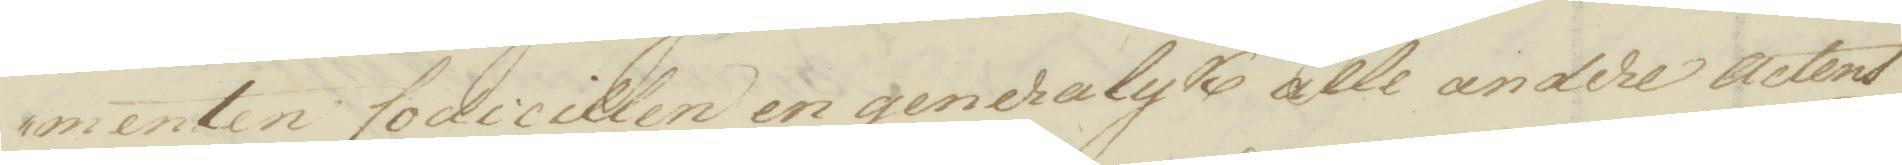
„menten, Codicillen en generalyk alle andere actens
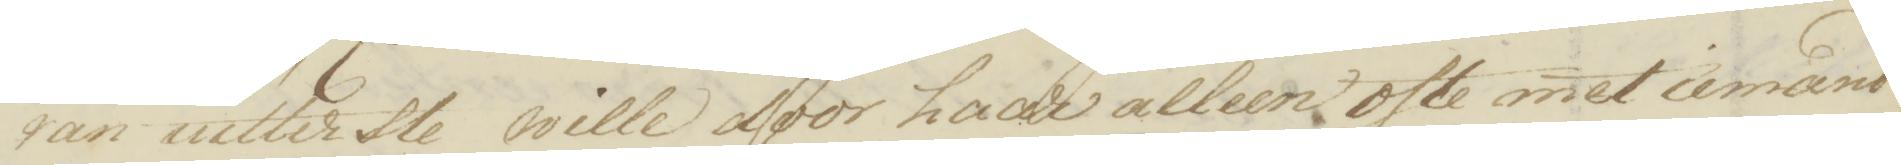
van uitterste wille door haar alleen ofte met iemand
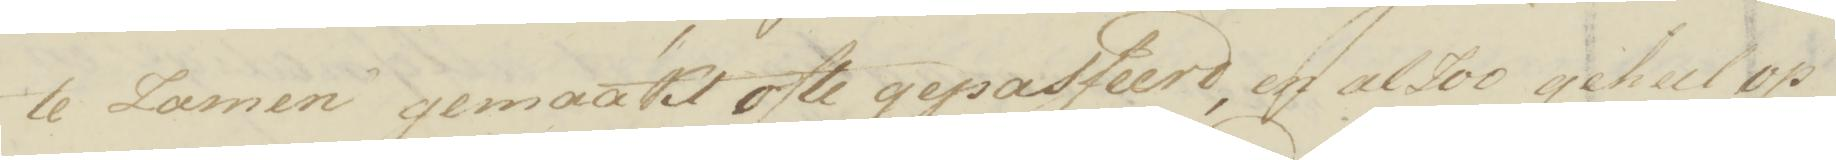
te zamen gemaakt ofte gepasseerd, en alzoo geheel op
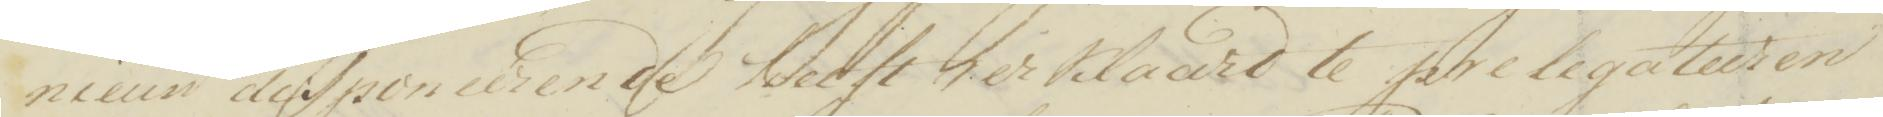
nieuw disponeerende heeft verklaard te prelegateeren
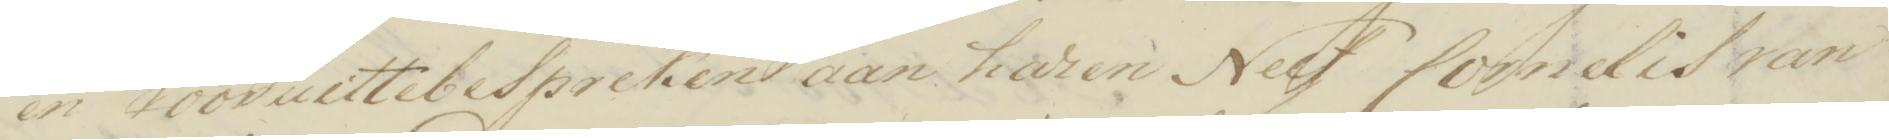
en vooruit te bespreken aan haren Neef Cornelis van
